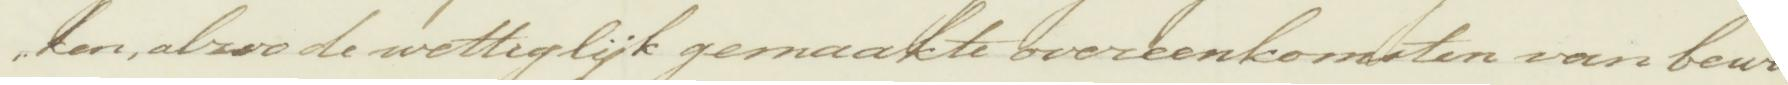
„ken, alzoo de wettiglijk gemaakte overeenkomsten van bewo
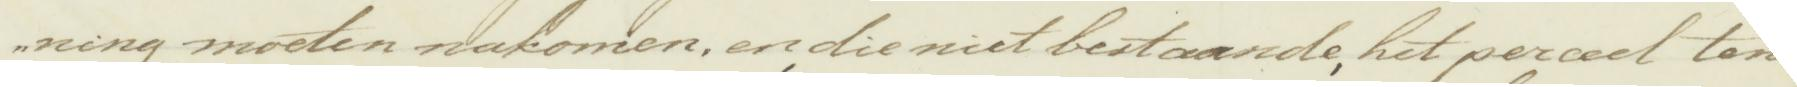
„ning moeten nakomen, en, die niet bestaande, het perceel ten
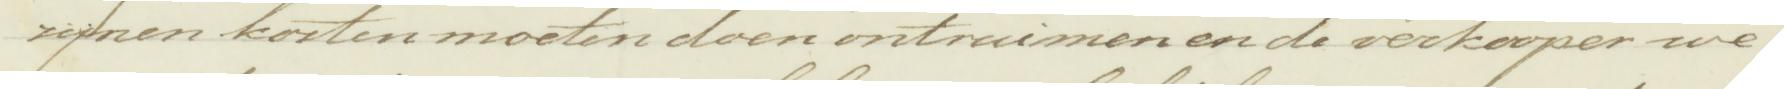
zijnen kosten moeten doen ontruimen en de verkooper we
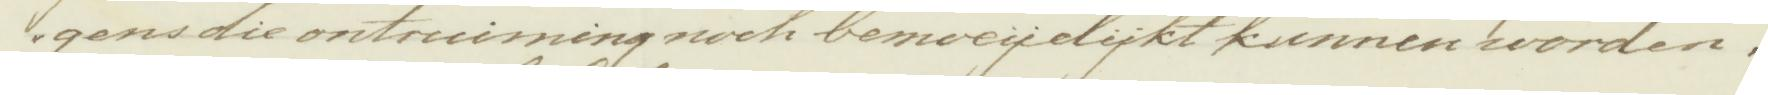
„gens die ontruiming noch bemoeijelijkt kunnen worden,
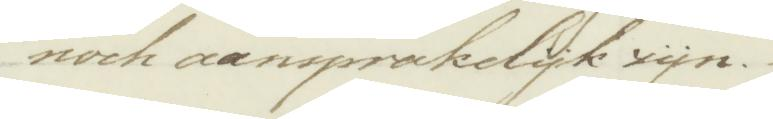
noch aansprakelijk zijn.
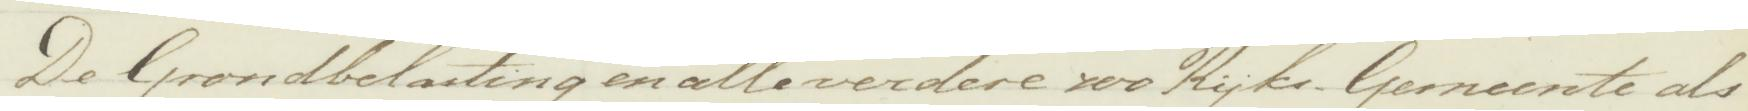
De Grondbelasting en alle verdere zoo Rijks- Gemeente als
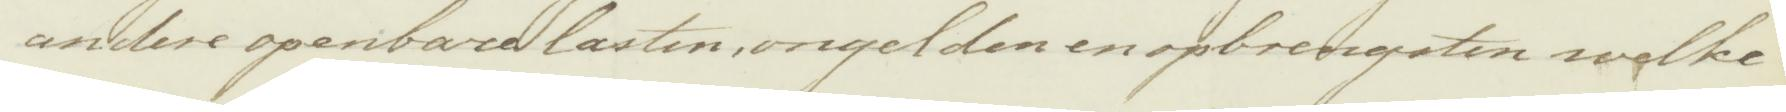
andere openbare lasten, ongelden en opbrengsten welke
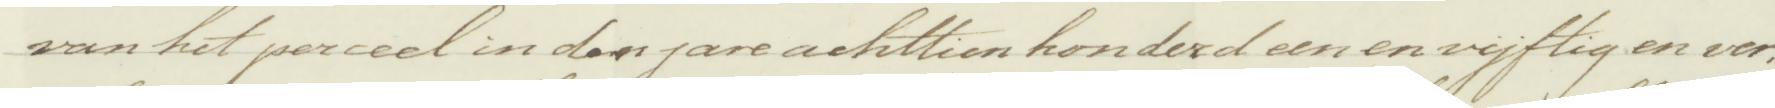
van het perceel in den jare achttien honderd een en vijftig en ver
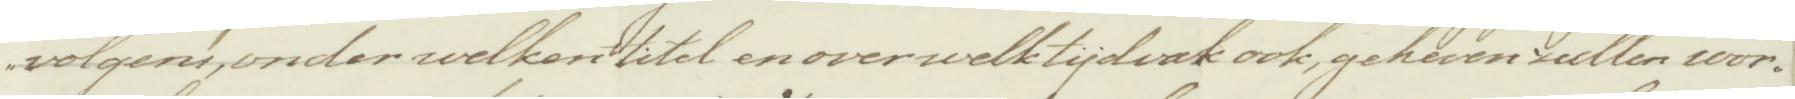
„volgens, onder welken titel en over welk tijdvak ook, geheven zullen wor„
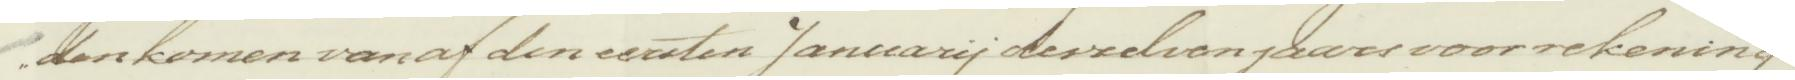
„den komen van af den eersten Januarij derzelven jaars voor rekening
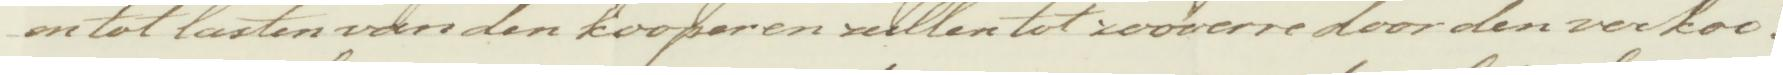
en tot lasten van den kooper en zullen tot zooverre door den verkoo„
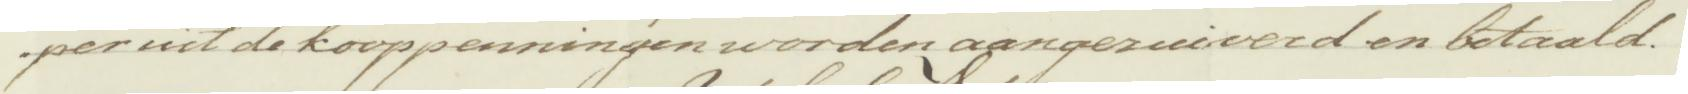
„per uit de kooppenningen worden aangezuiverd en betaald.
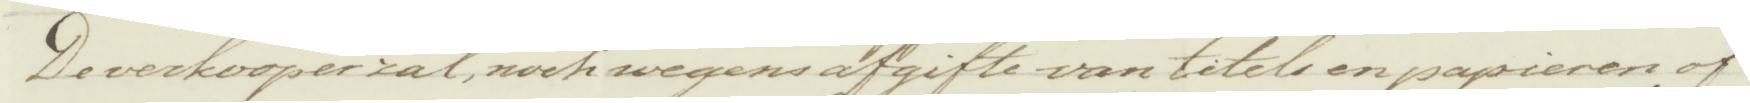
De verkooper zal, noch wegens afgifte van titels en papieren, of
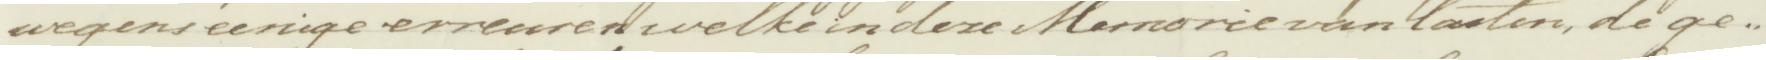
wegens eenige erreuren welke in deze Memorie van lasten, de ge„
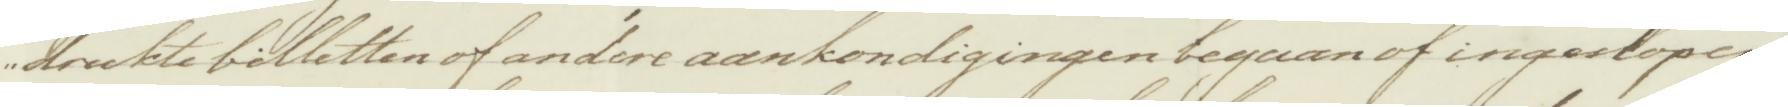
drukte billetten of andere aankondigingen begaan of ingeslopen
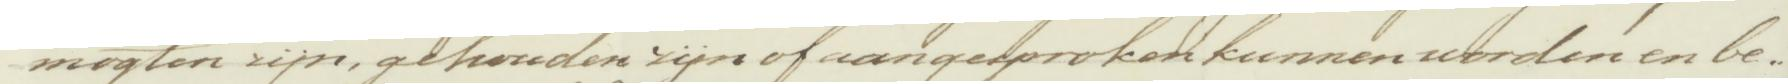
mogten zijn, gehouden zijn of aangeproken kunnen worden en be„
